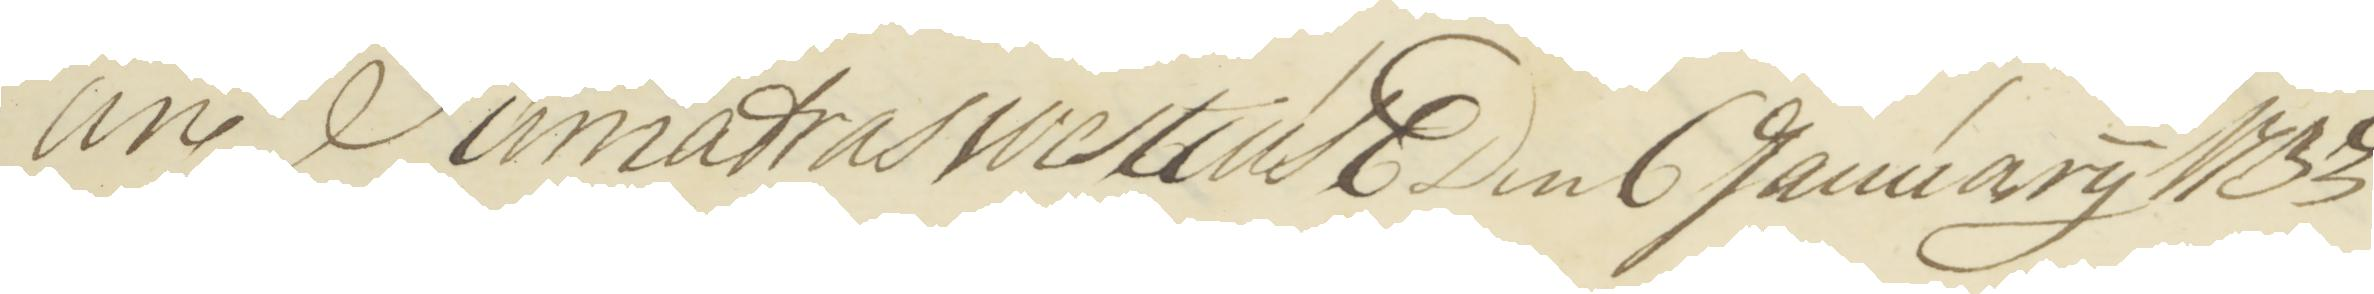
Van Sumatras westcust Den 6 Januarij 1733.
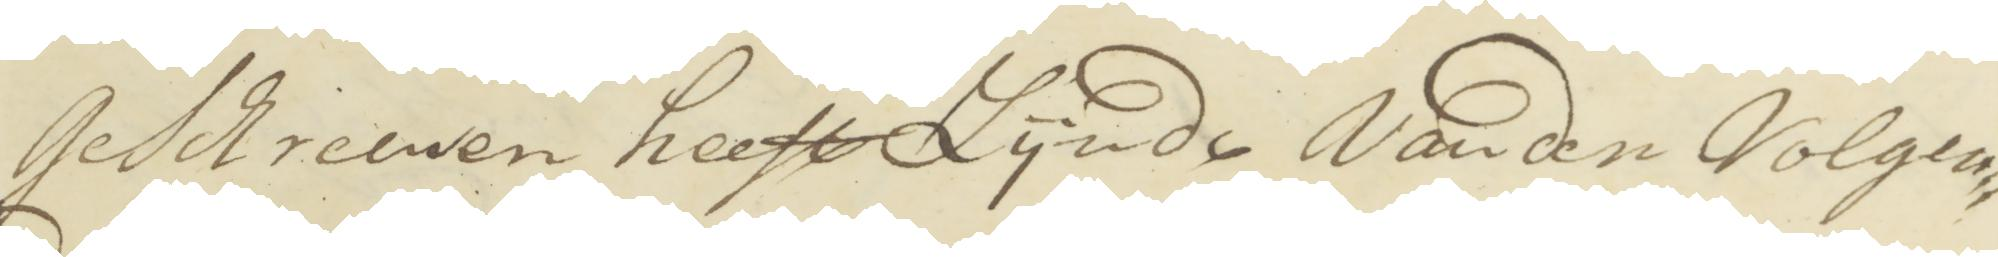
geschreven heeft zijnde van den volgen„
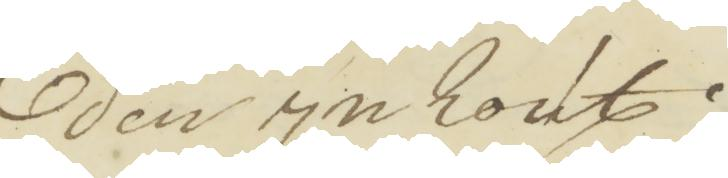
den jnhout;
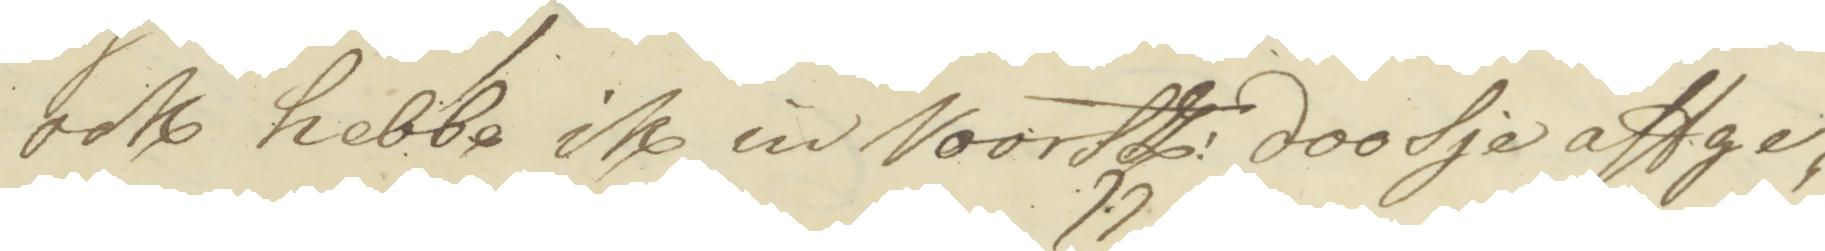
ook hebbe ik in voorsz: doosje affge
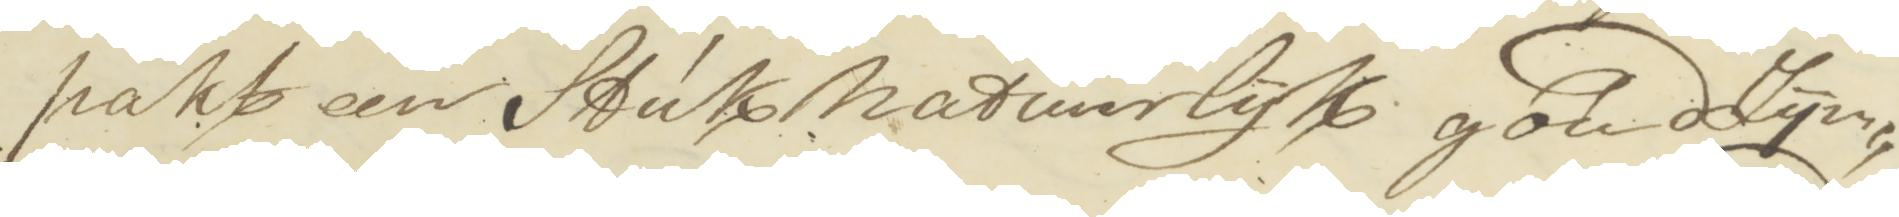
pakt een stuk natuurlijk goud zijn„
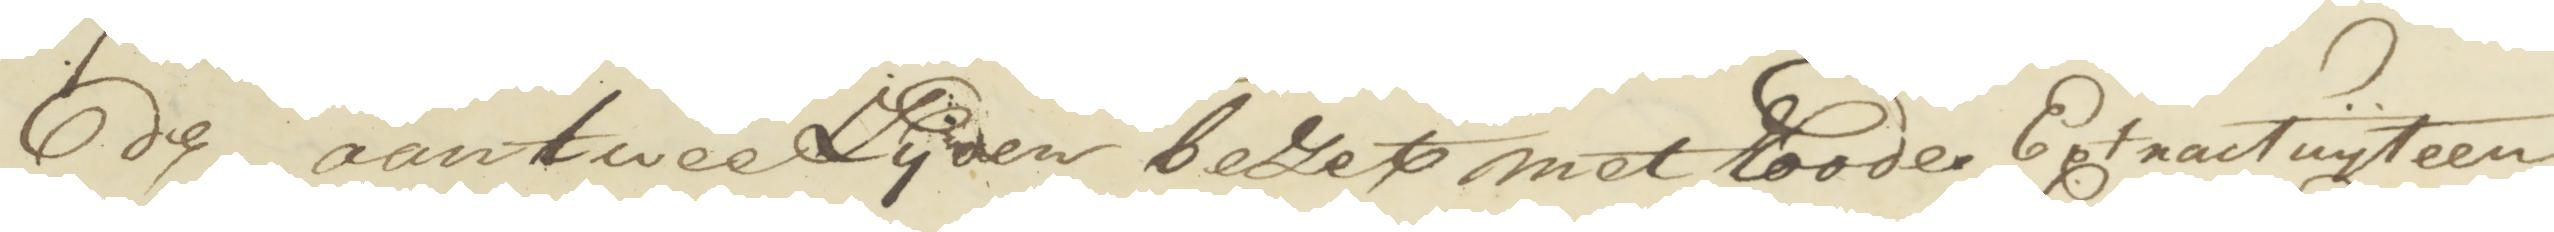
de aan twee zijden bezet met loode Extract uijt een
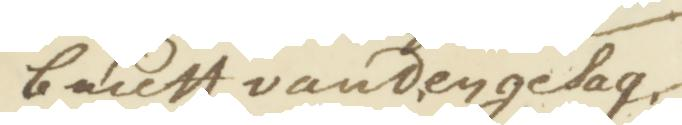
brieff van den gesag„
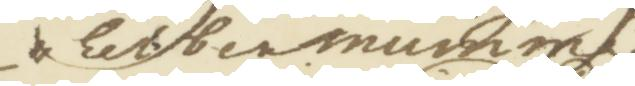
„hebber mumme s
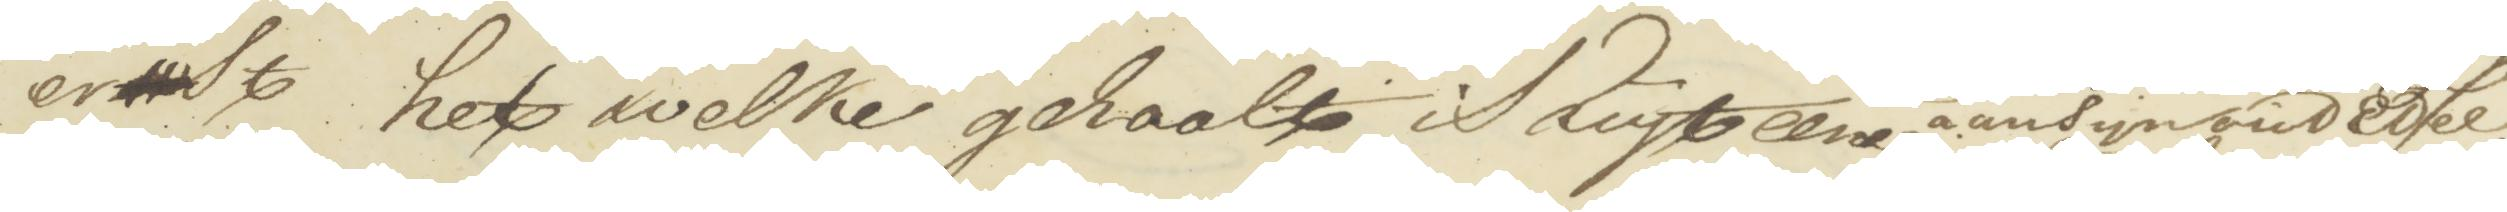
ernst het welke gehaalt is uijt een aan sijn oud edel
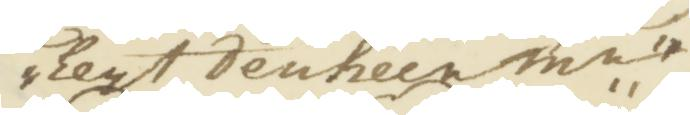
„heyt den heer m„r
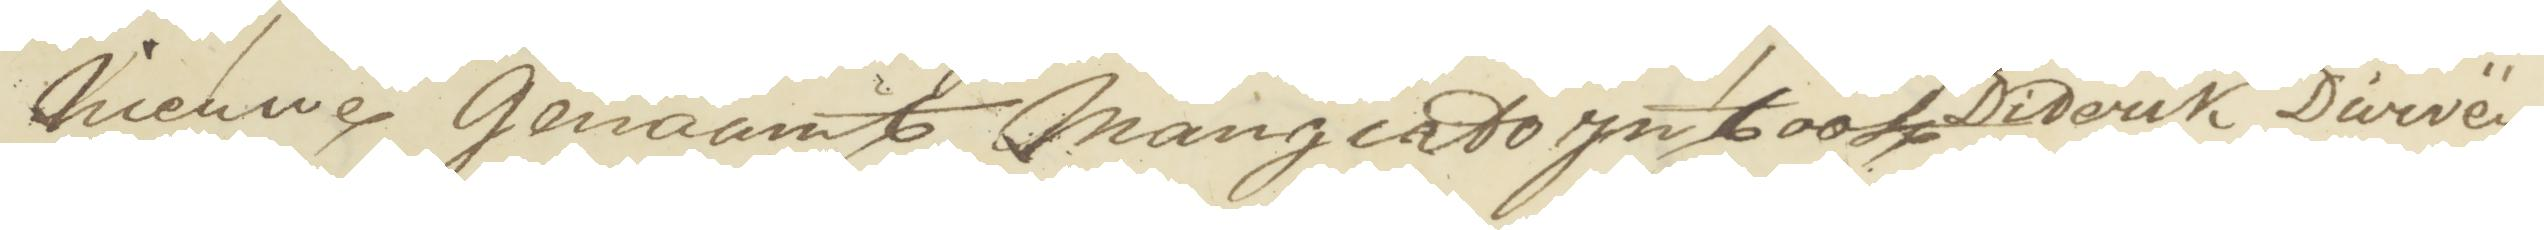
nieuwe genaamt mangiato jn 't oost Diderik Durven
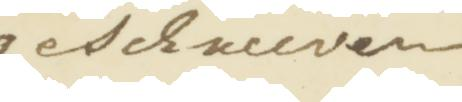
geschreeven
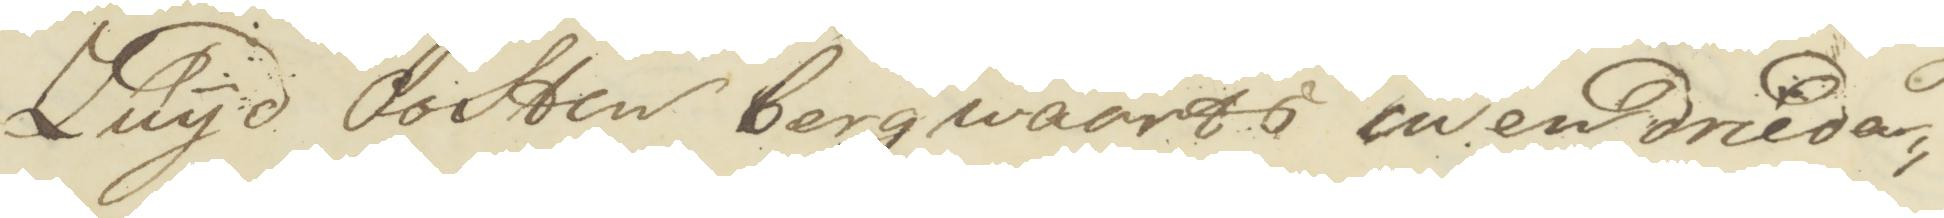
Zuijd Oosten bergwaarts in en drieda„
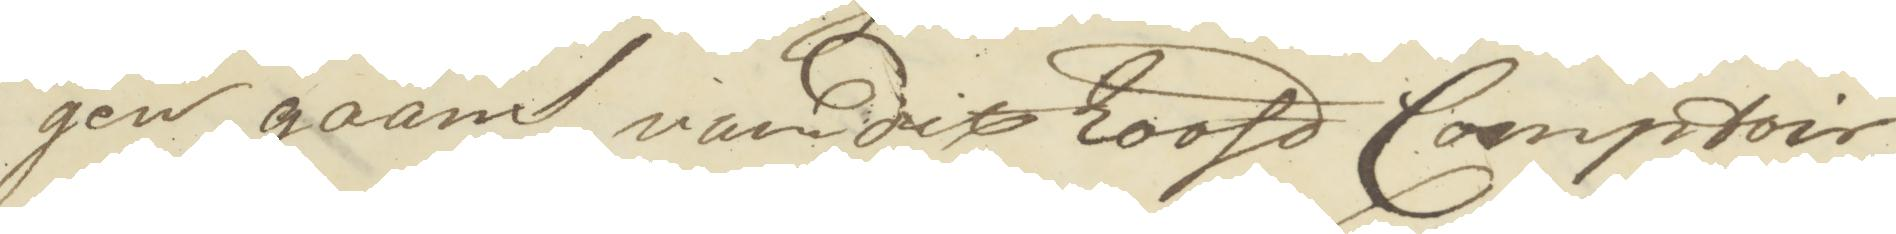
gen gaans van dit hoofd Comptoir
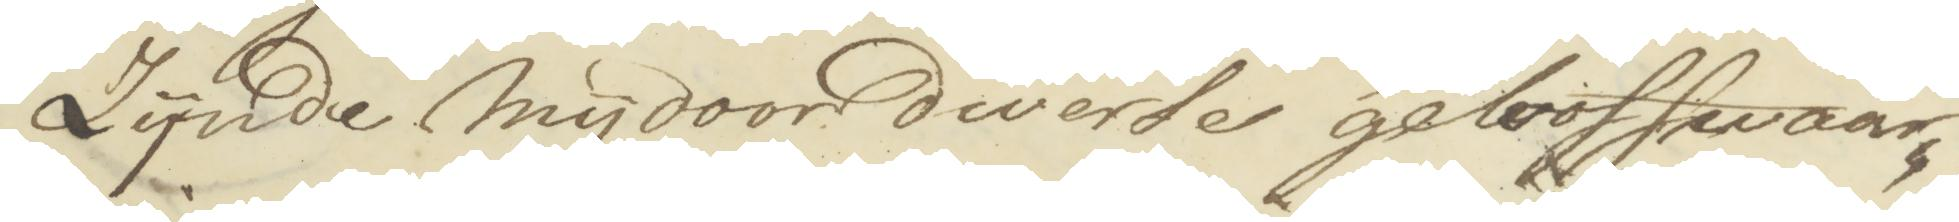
zijnde mij door diverse gelooffwaar„
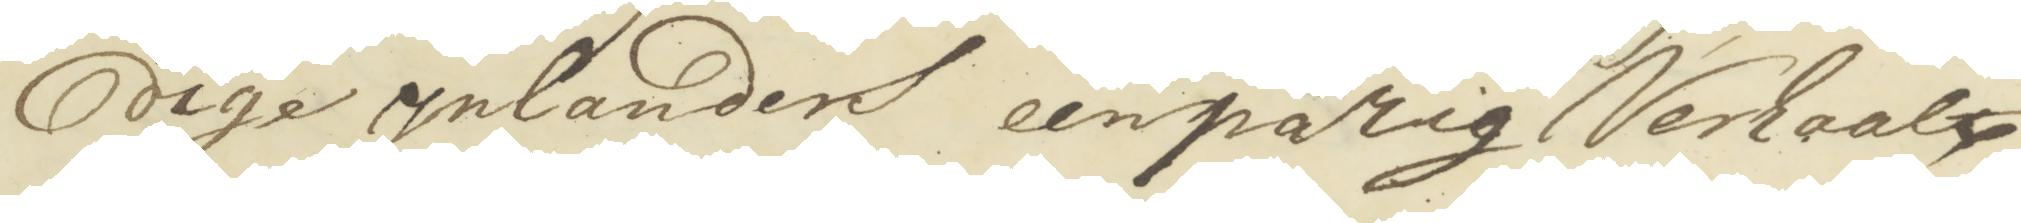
dige jnlanders een parig verhaalt
